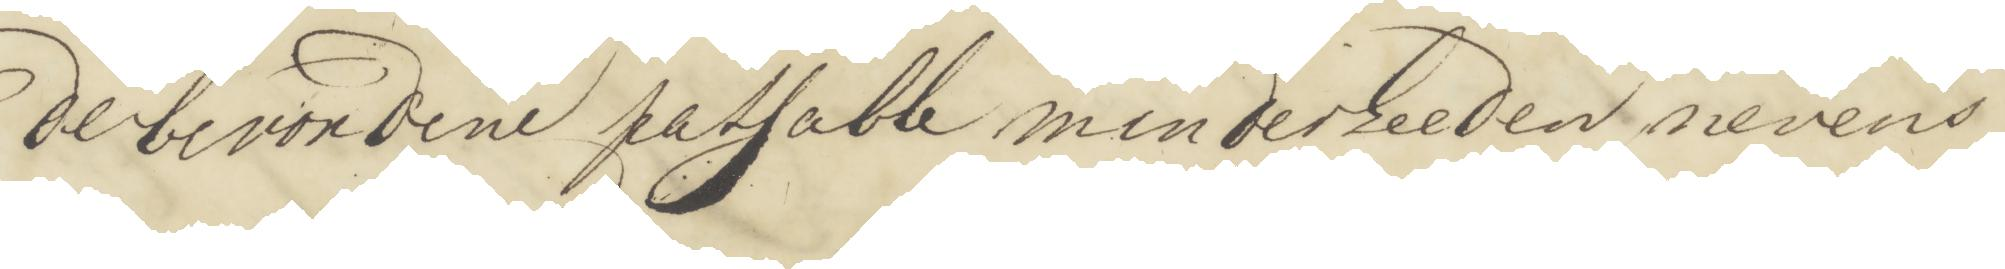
de bevondene passable minderheeden, nevens
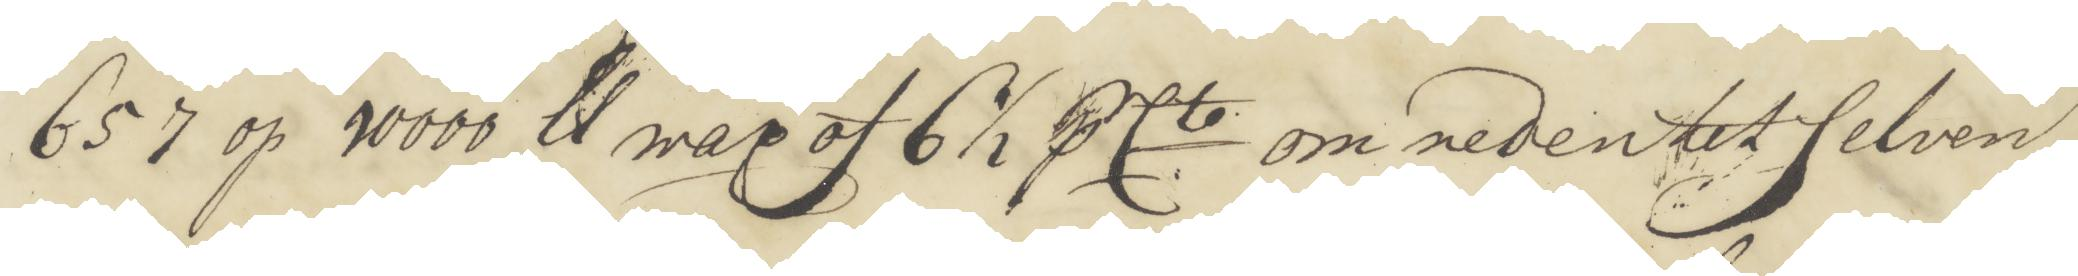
657 op 10000 lb wax of 6½ p=r C=to om reden het selven
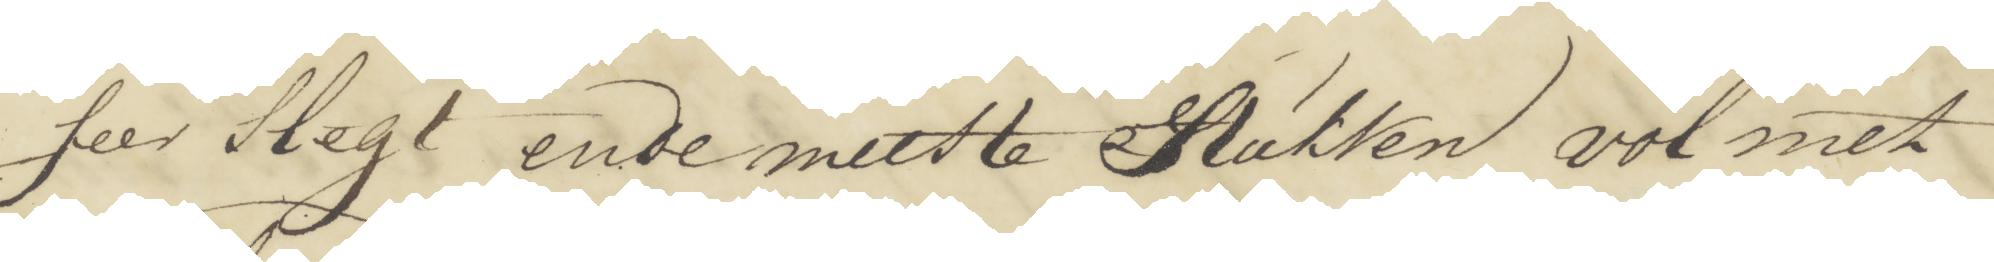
seer slegt ende meeste Stukken vol met
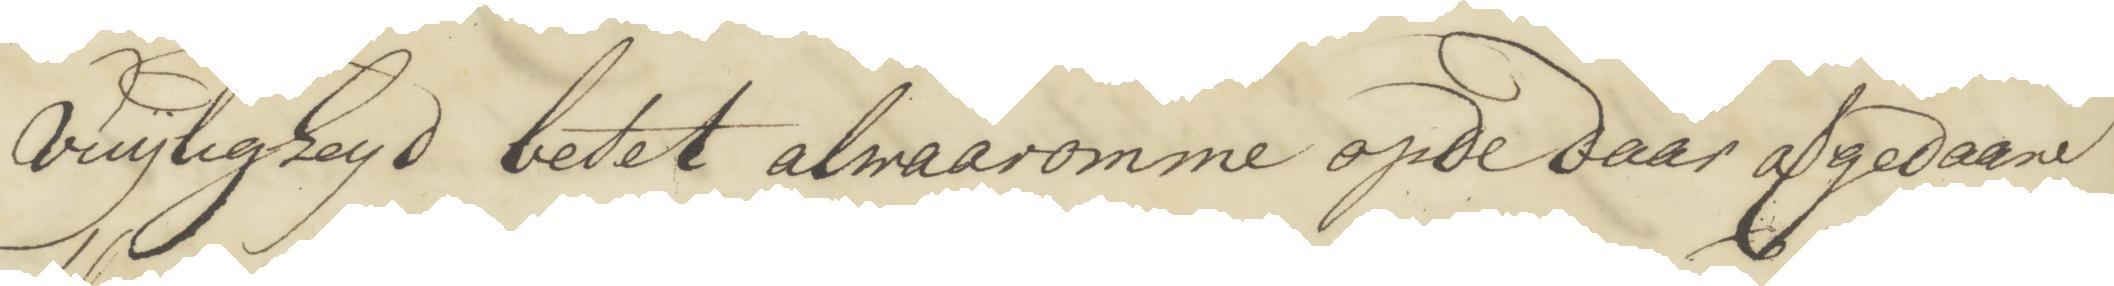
vuijligheijd beset alwaaromme opde daar overgedaane
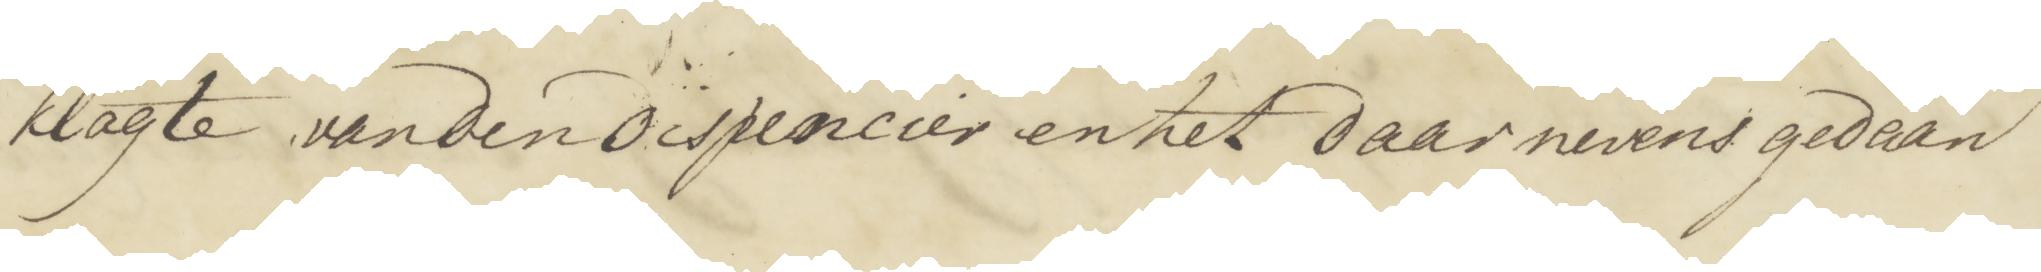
klagte van den dispencier en het daar nevens gedaan
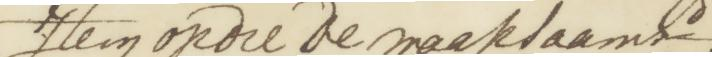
Jtem op die de waaksaamh=d
